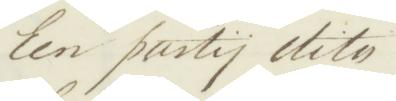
Een partij dito
